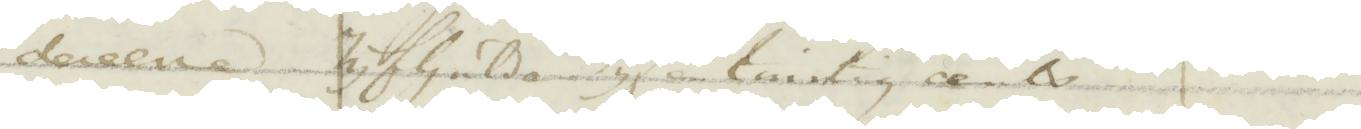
dezelve vijf Gulden vijf en twintig cents
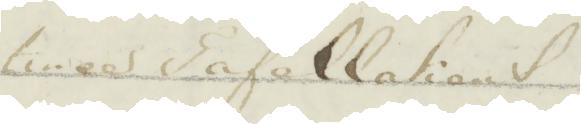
twee Tafellakens
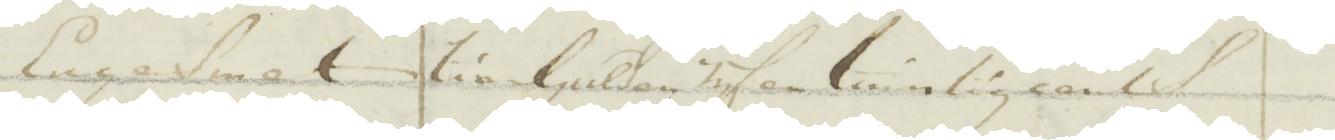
Engesmet tien Gulden vijf en twintig cents
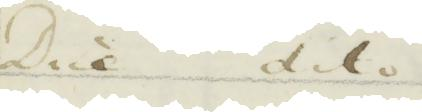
Drie dito
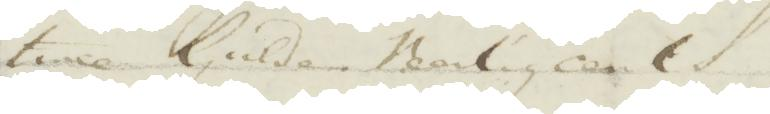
twee Gulden veertig cents
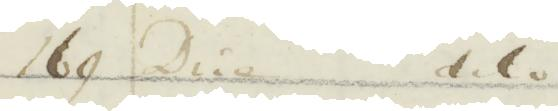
169 Drie dito
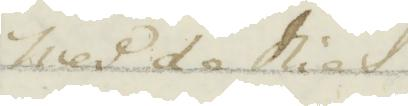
Wed de Nias
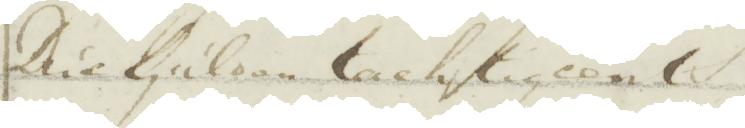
Drie Gulden tachtig cents
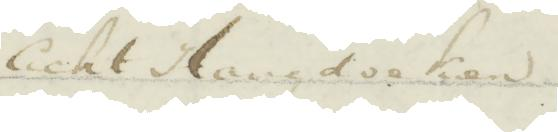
Acht Hangdoeken
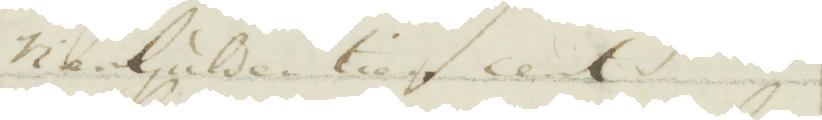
Vier Gulden tien cents
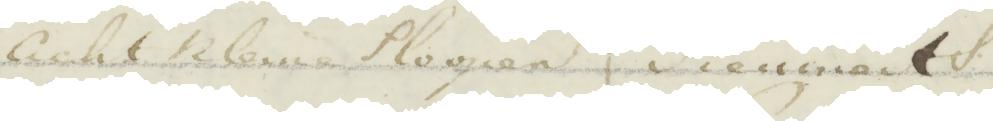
Acht Kleine slopen Sieuwerts
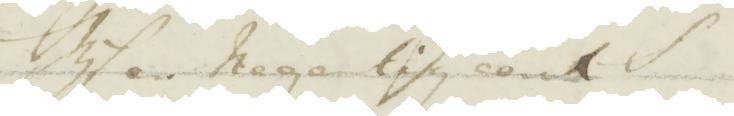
Vijf en negentig cents
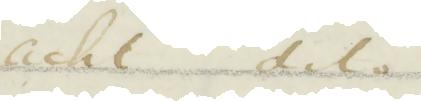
Acht dito
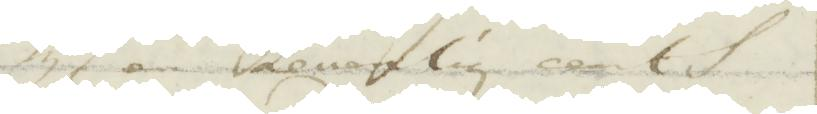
Vijf en Zeventig Cents
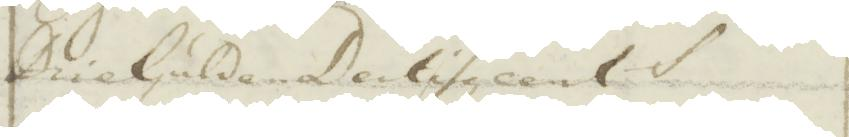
Drie Gulden Dertig cents
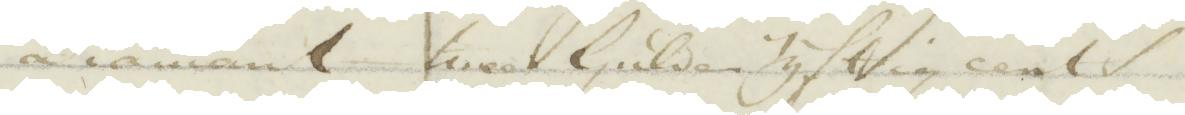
Diamant twee Gulden Vijftig cents
